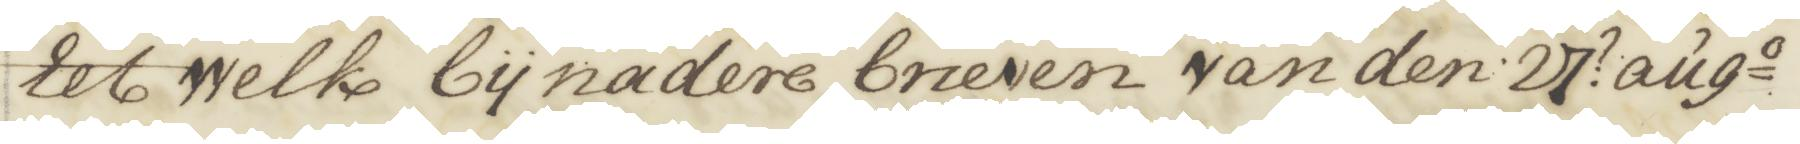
het welk bij nadere brieven van den 27:' aug=o
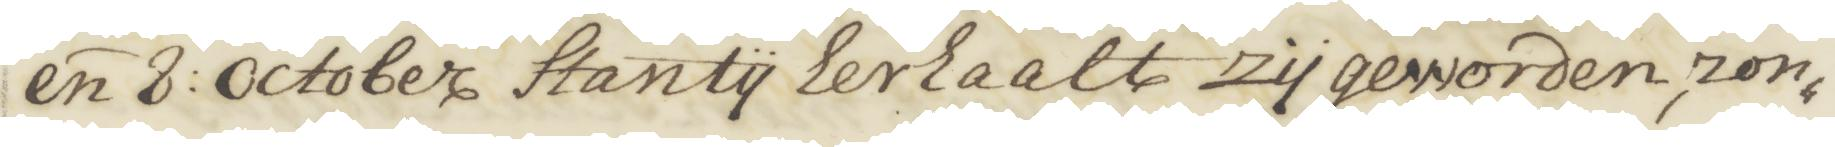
en 8: october stantij herhaalt zij geworden, zon„
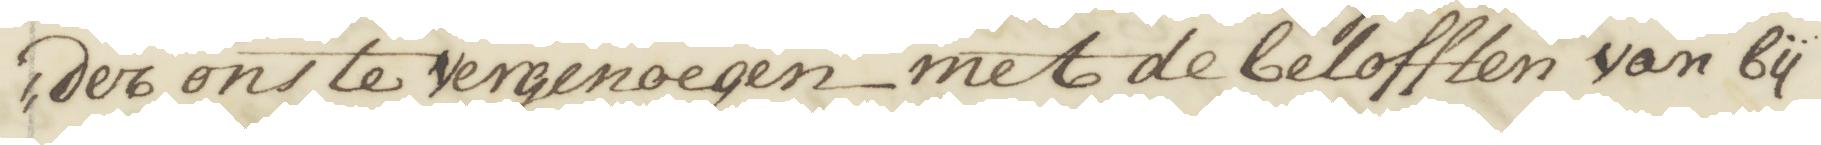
„der ons te vergenoegen met de belofften van bij
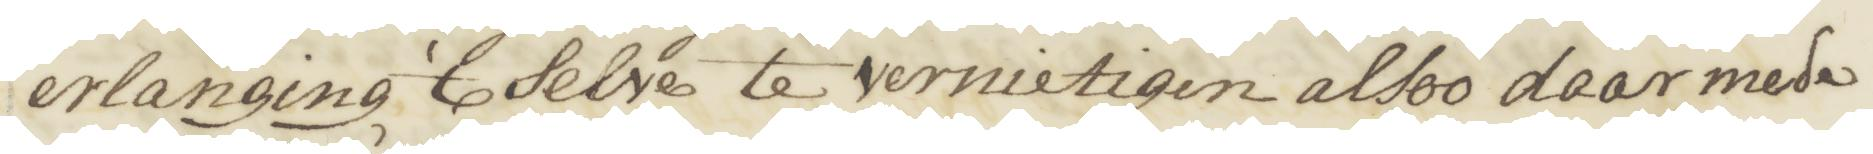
erlanging 't selve te vernietigen alsoo daar mede
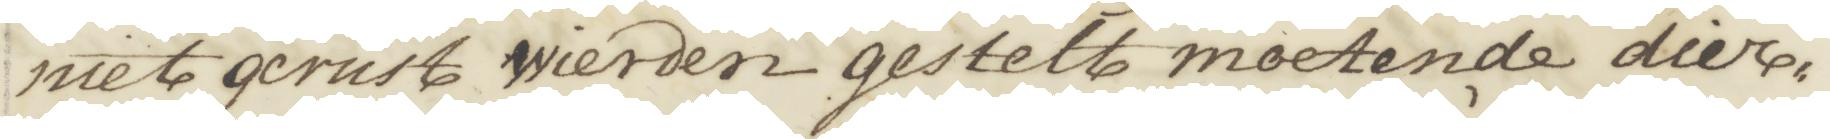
niet gerust wierden gestelt moetende dier„
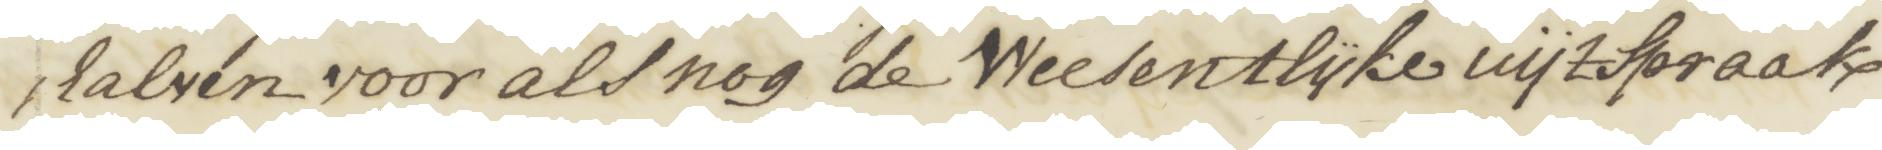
„halven voor als nog de Weesentlijke uijtspraak
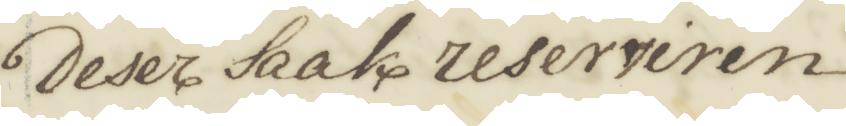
deser saak reserviren
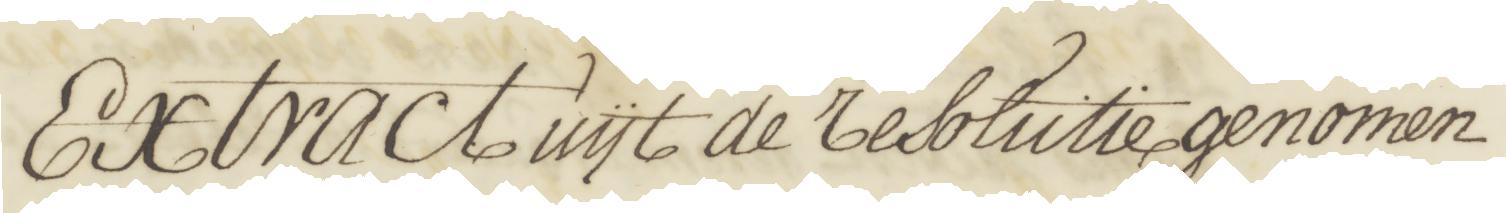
Extract uijt de Resolutie genomen
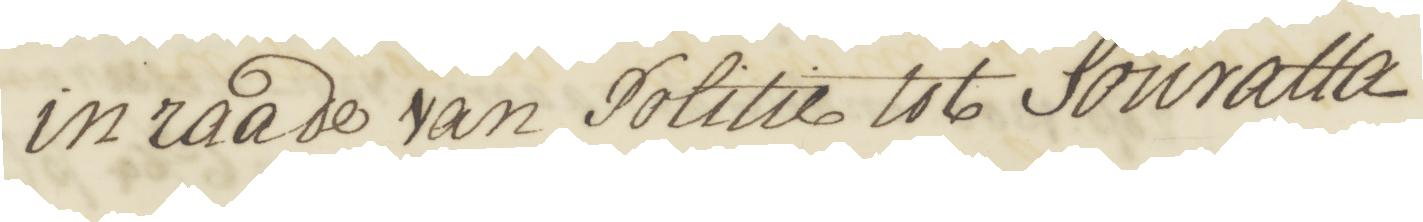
in raade van Politie tot Souratta
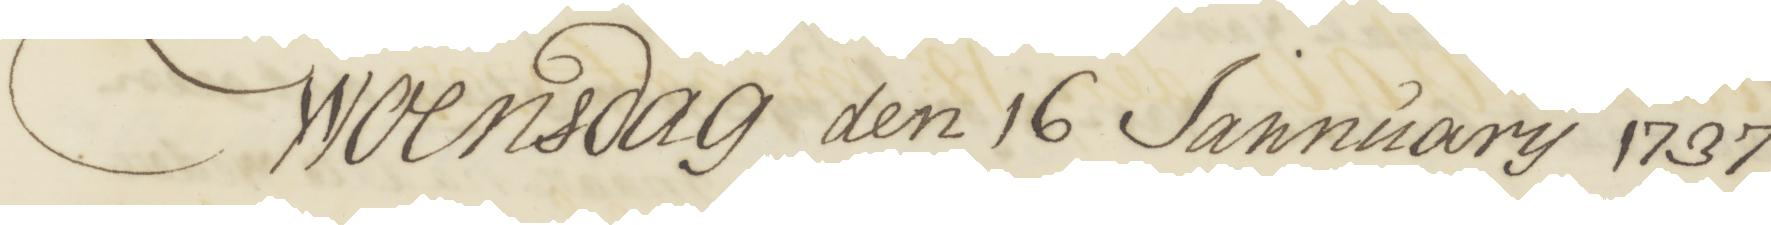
Woensdag den 16 Iannuarij 1737
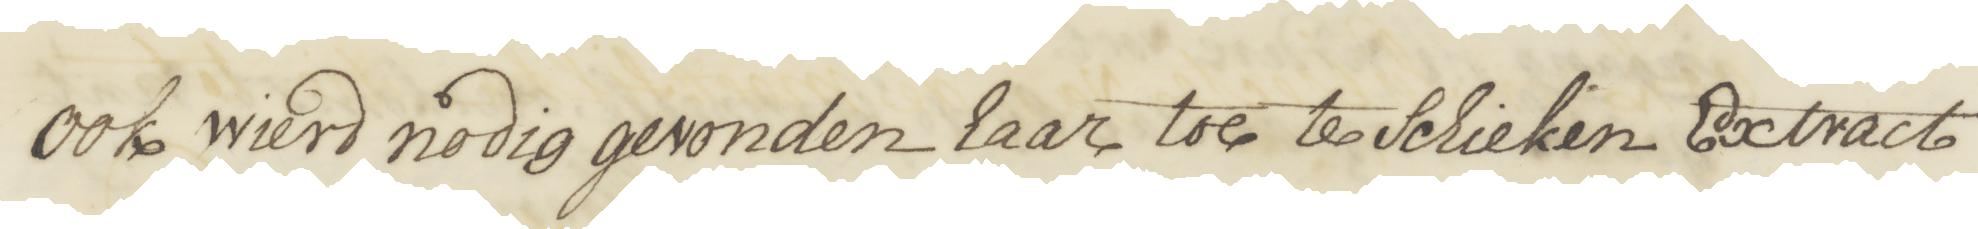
ook wierd nodig gevonden haar toe te schieken Extract
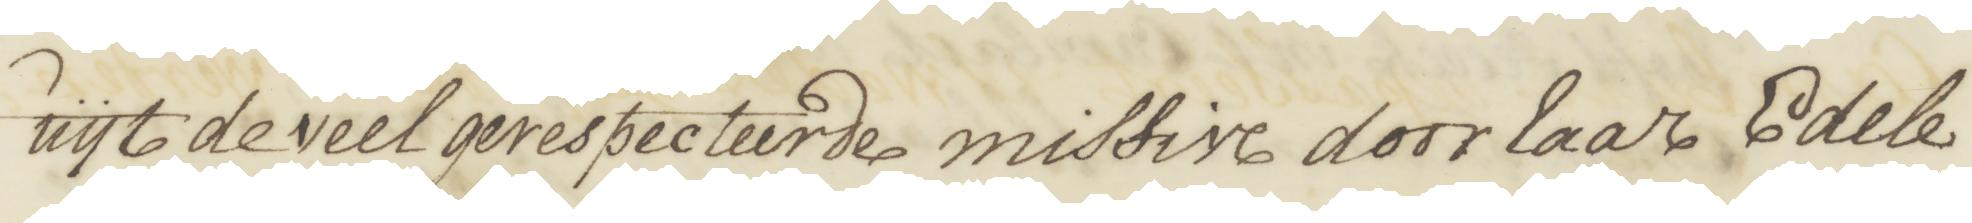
uijt de veel gerespecteerde missive door haar Edele
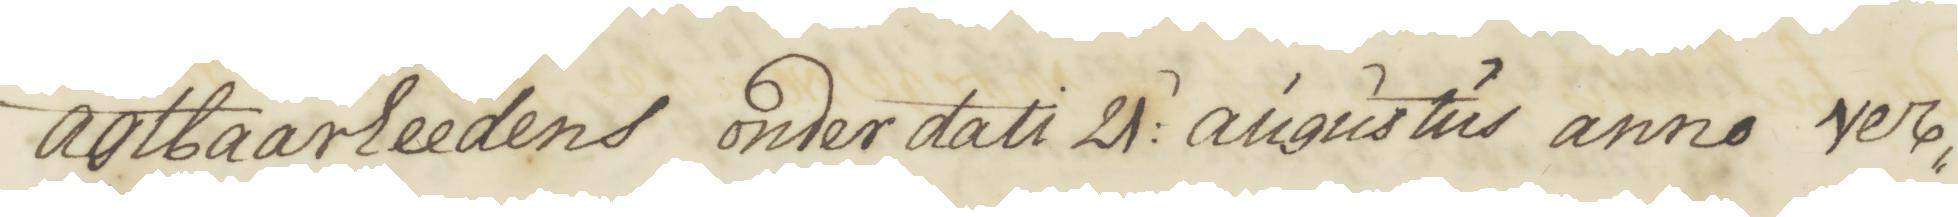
agtbaarheedens onder dati 21:' augustus anno ver„
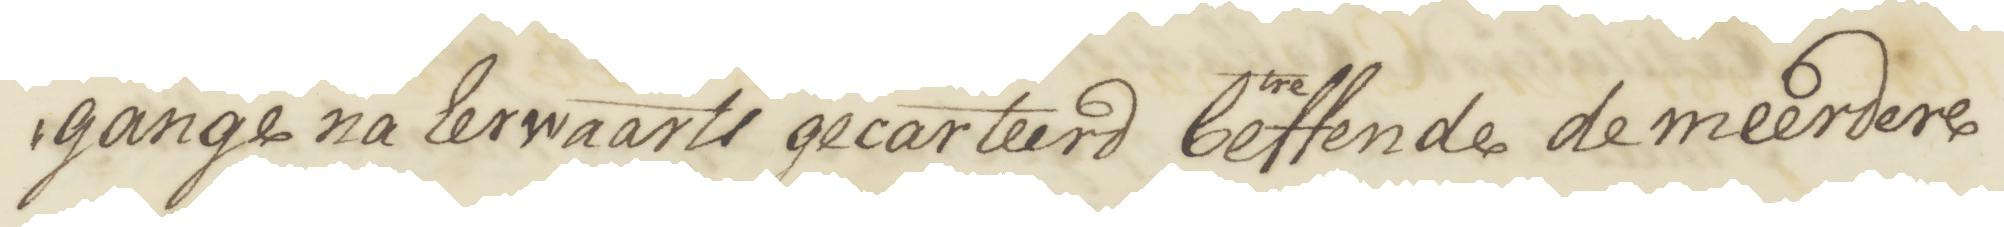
„gange na herwaarts gecarteerd betreffende de meerdere
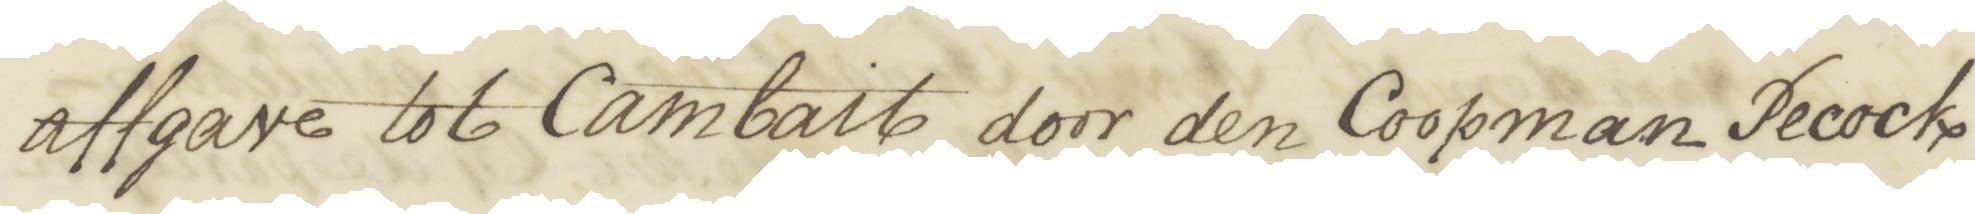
affgave tot Cambait door den Coopman Pecock,
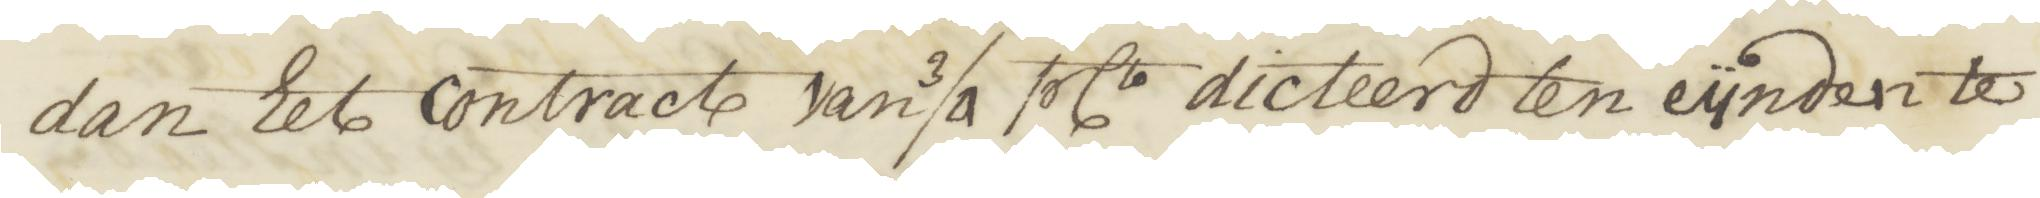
dan het contract van ¾ pCto dicteerd ten eijnden te
